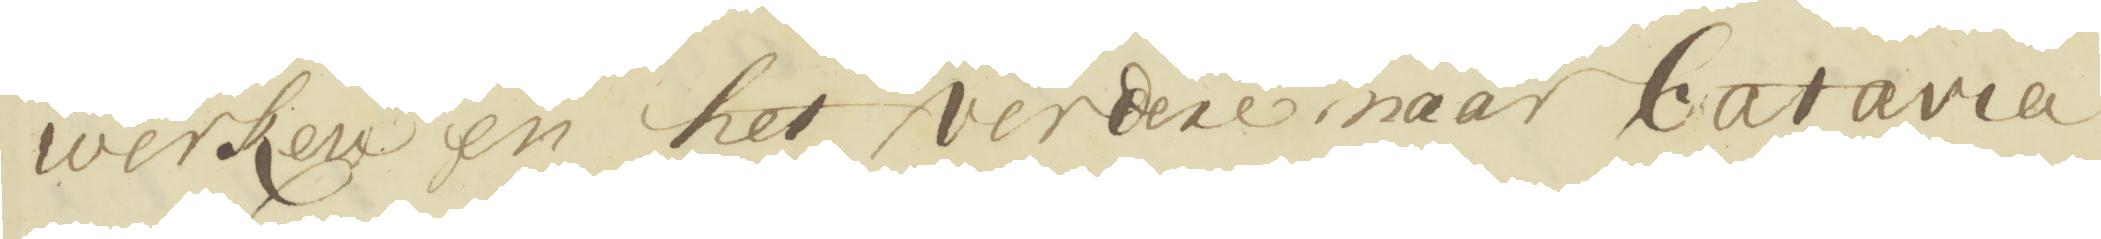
werken en het verdere naar batavia
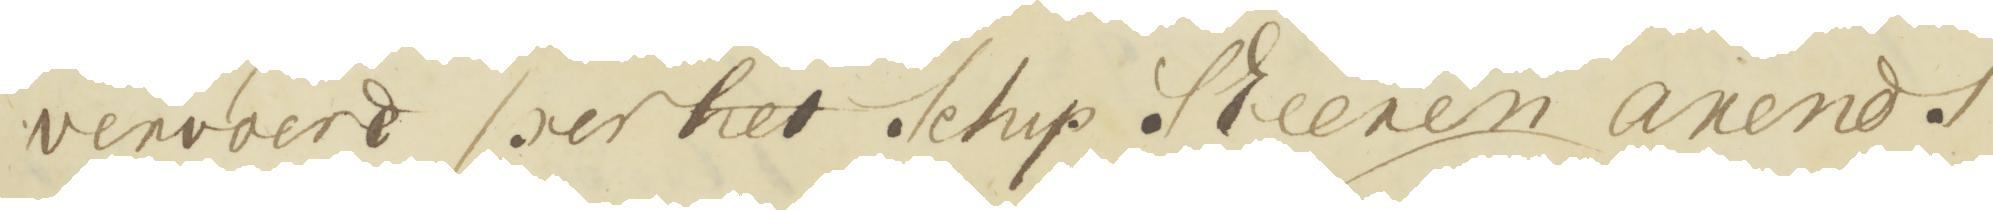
vervoerd per het schip Sheeren arends
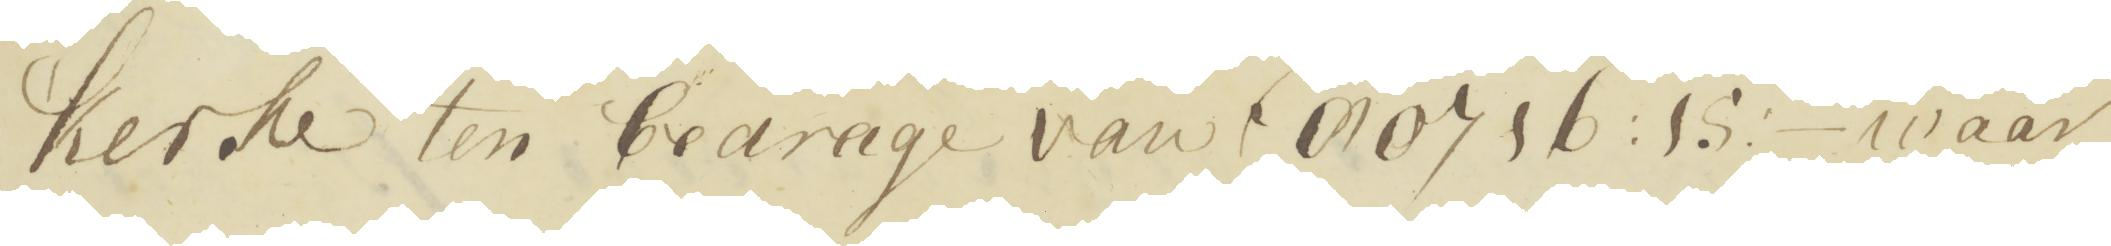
kerke ten bedrage van ƒ 80716:15:— waar
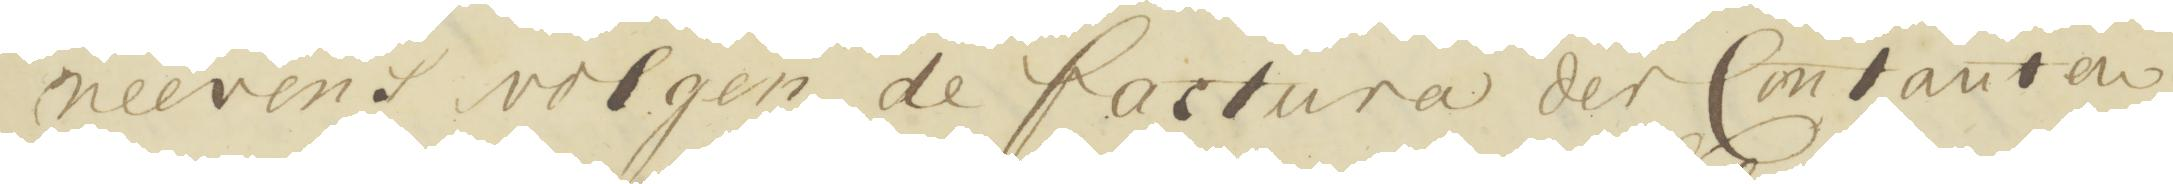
neevens volgen de factura der Contanten
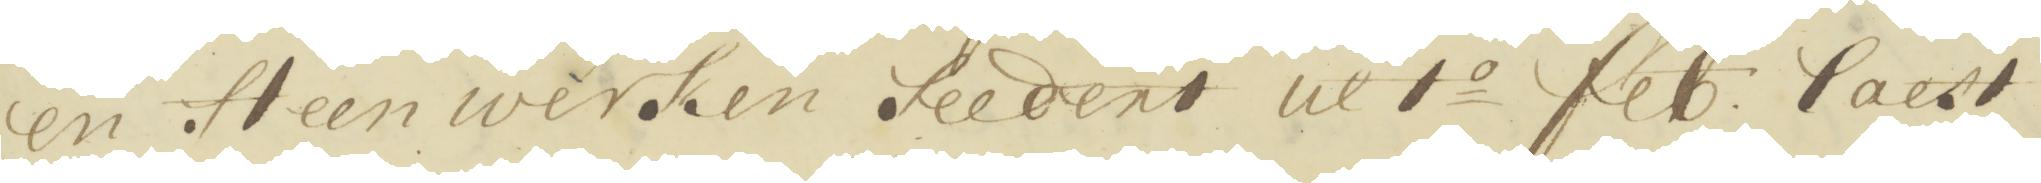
en steen werken seedert ult=o feb: laest
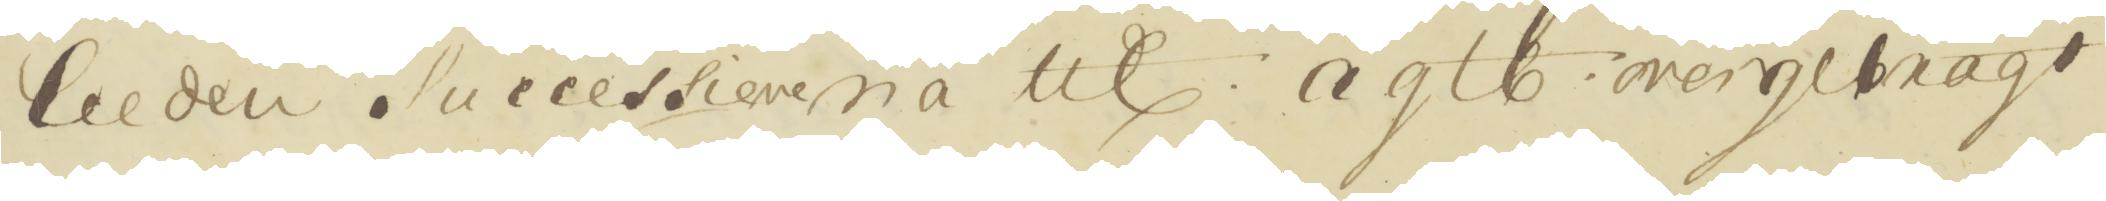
leeden successieve na UE: agtb: overgebragt
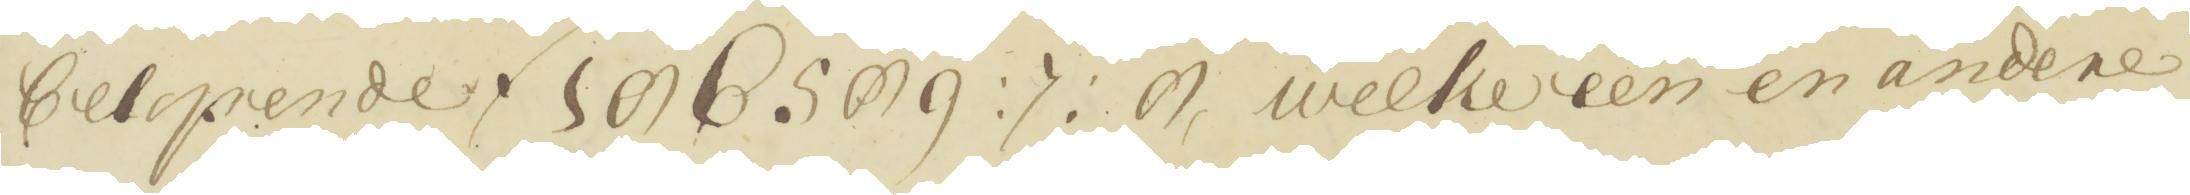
belopende ƒ 186589:7: 8, welke een en andere
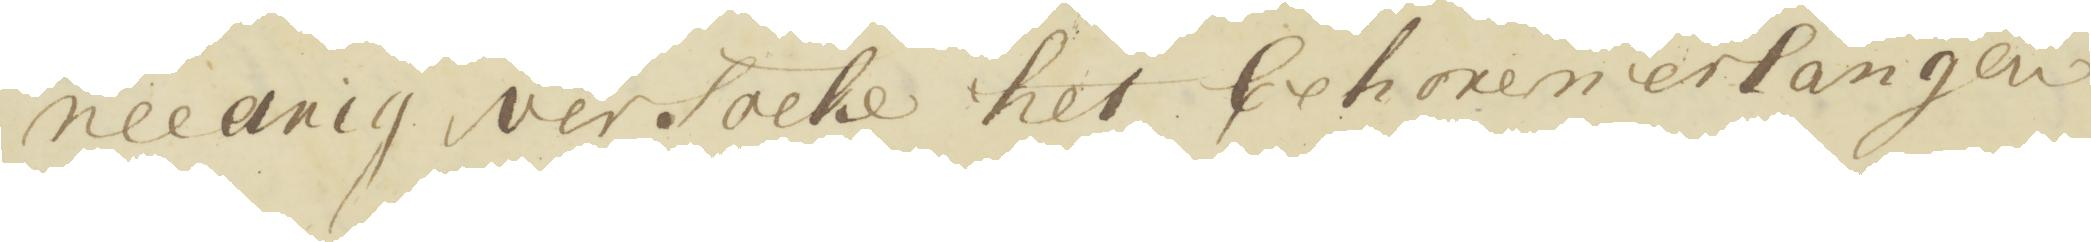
needrig versoeke het behoren erlangen
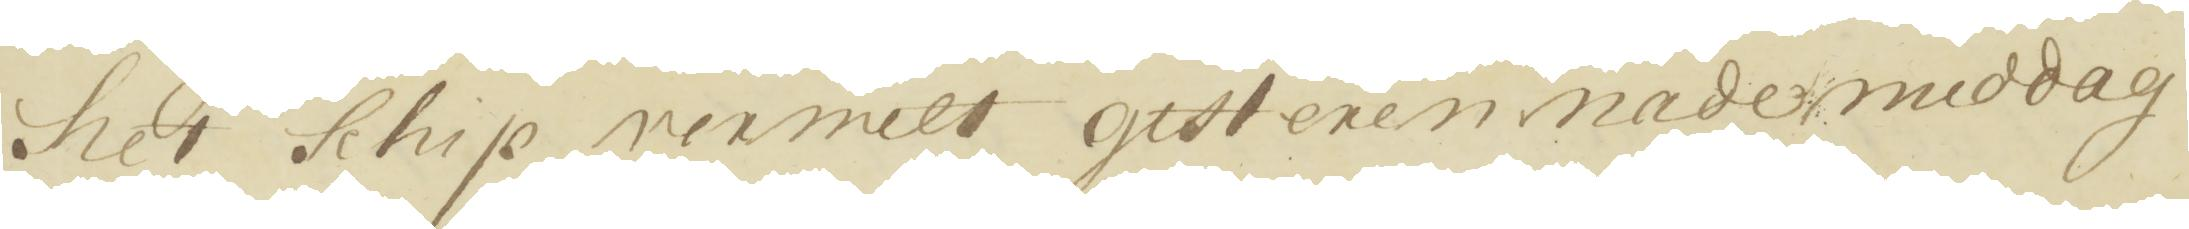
het schip vermelt gisteren nade middag
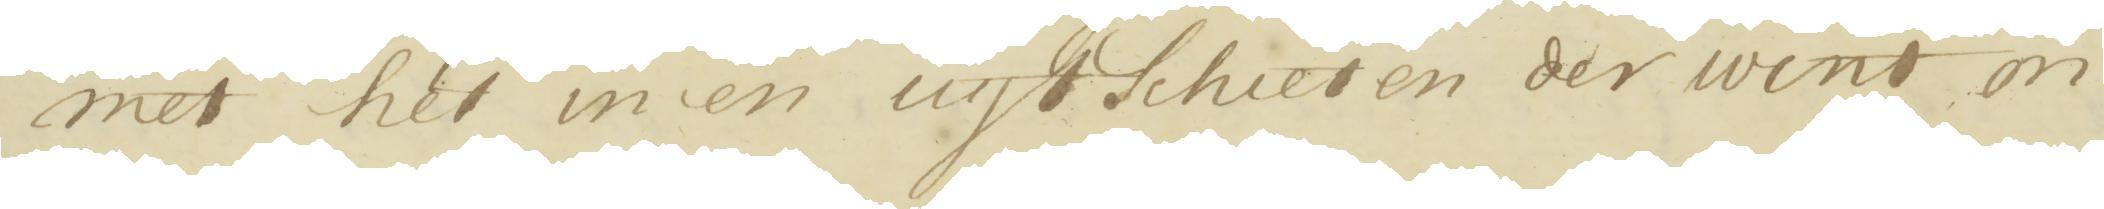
met het in en uytschieten der wint on
